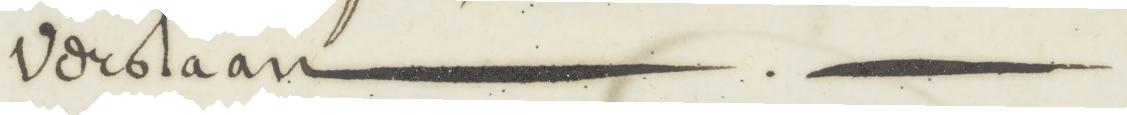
verslaan. —
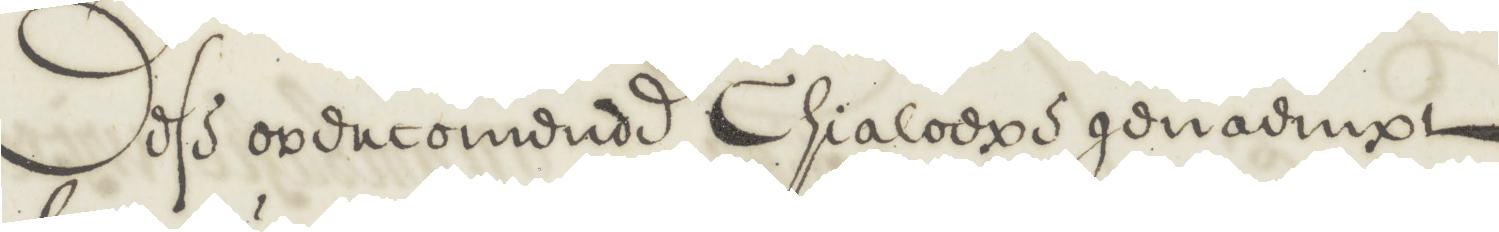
Dese overcomende Chialoepe genaempt
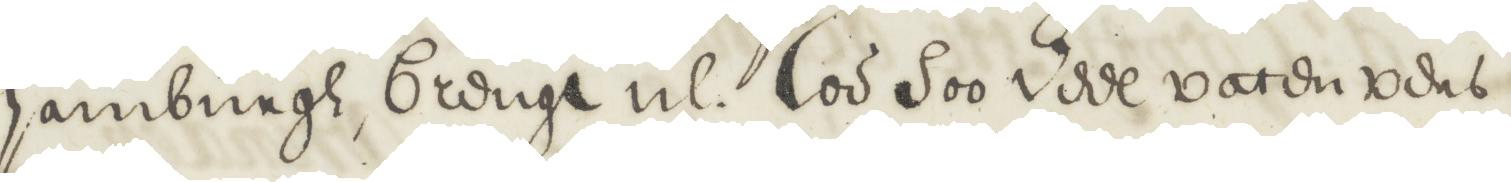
hamburgh, brengt ul. toe soo veel vaten vers
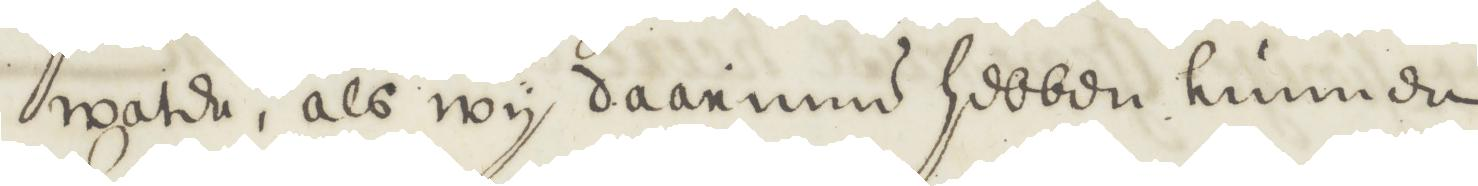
water, als wij daarinne hebben kunnen
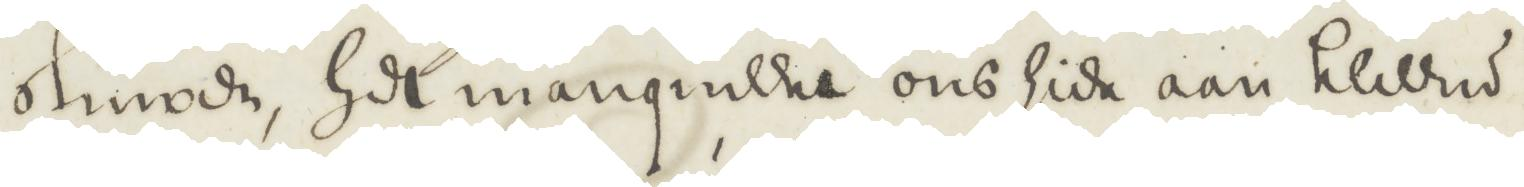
stuwen, het manqueert ons hier aan kleene
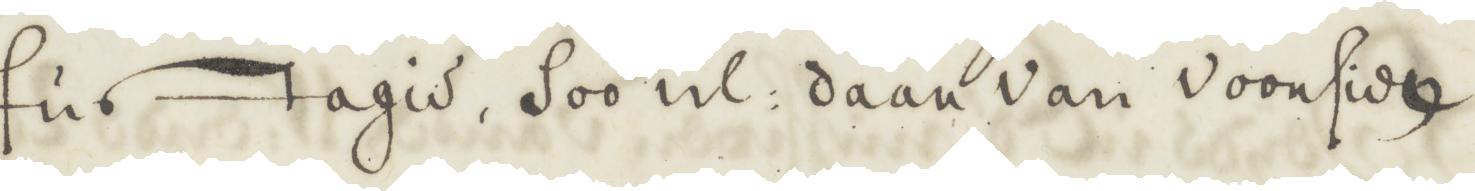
fustagie, soo ul: daar van voorsien
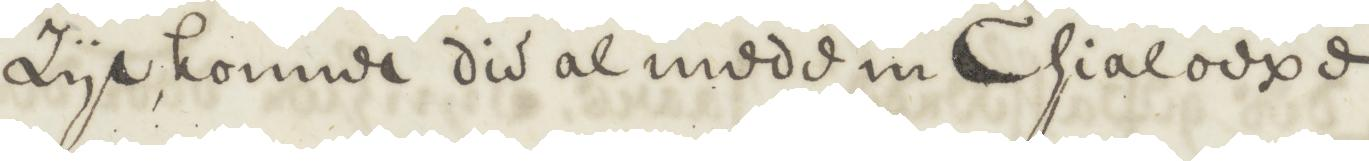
zijt, konnet die al mede in Chialoepe
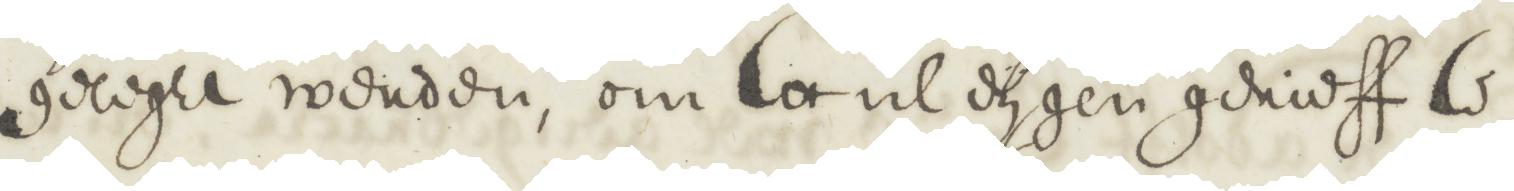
geleght werden, om tot ul eijgen gerieff te
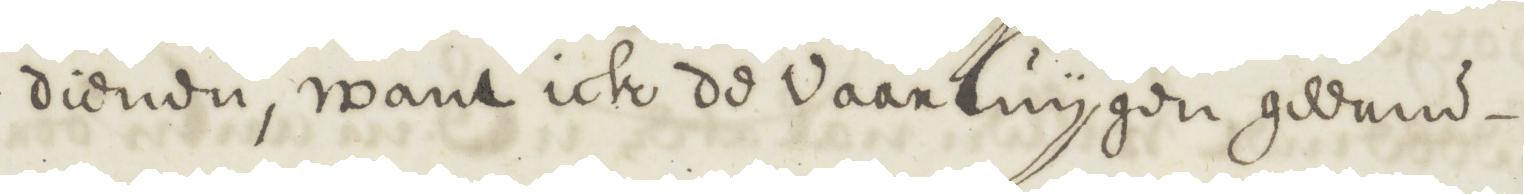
dienen, want ick de vaartuijgen geerne —
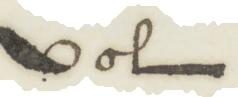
vol.
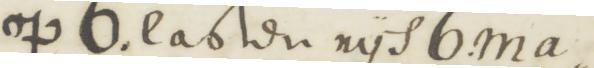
op 6. lasten rijs 6. ma
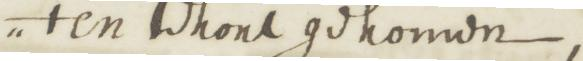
„ten tekort gekomen,
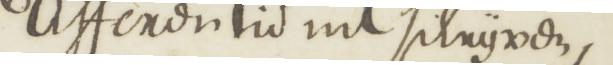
differentie in’t schrijven,
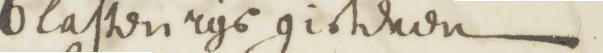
6 lasten rijs gisteren
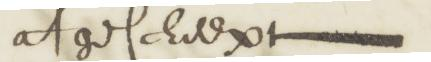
afgescheept
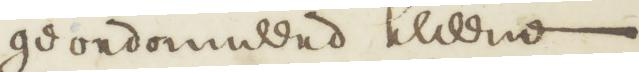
geordonneerd kleene
